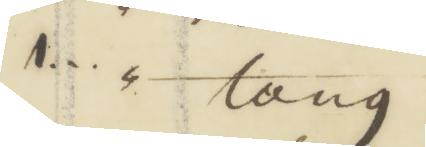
1.-. „ tang
